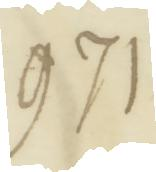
971
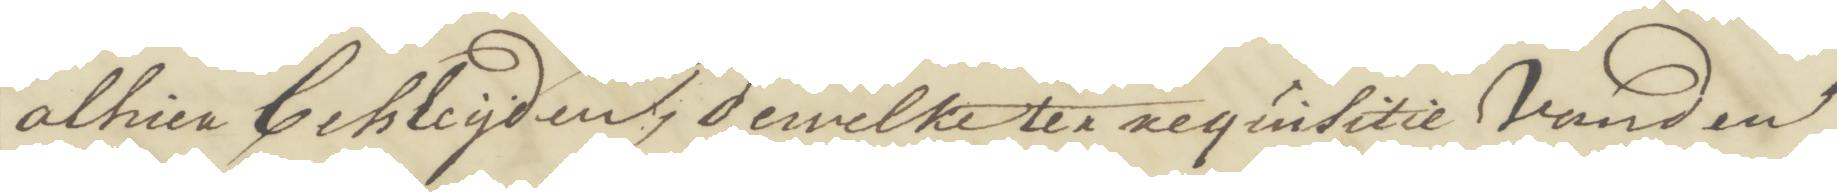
alhier bescheijden, dewelke ter requisitie van den
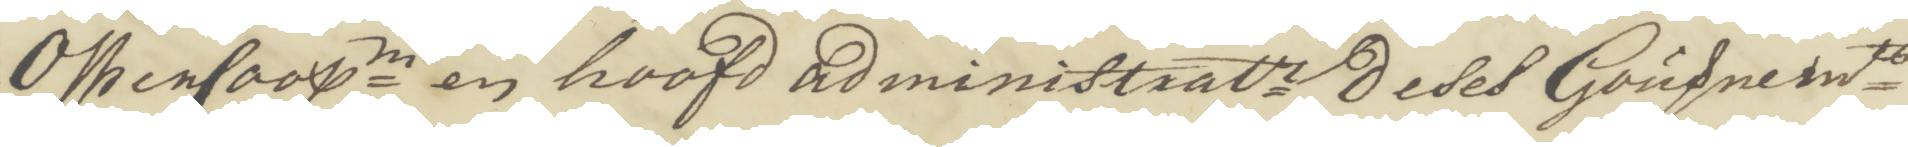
Oppercoop=m en hoofd administrat=r deses Gouvernem=ts
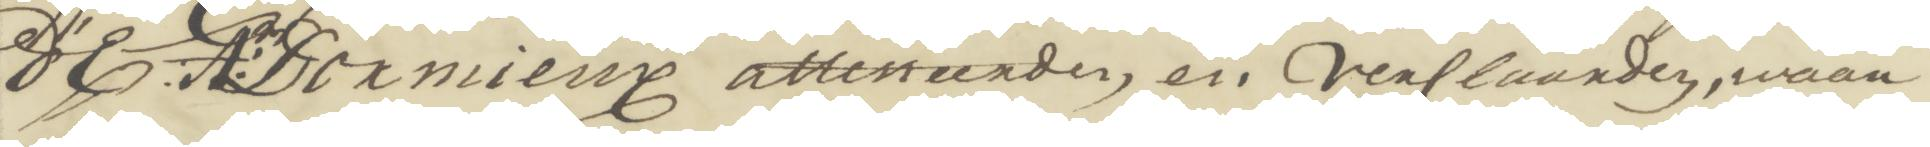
d'E: A:m Dormieux attesteerden en verclaarden, waar
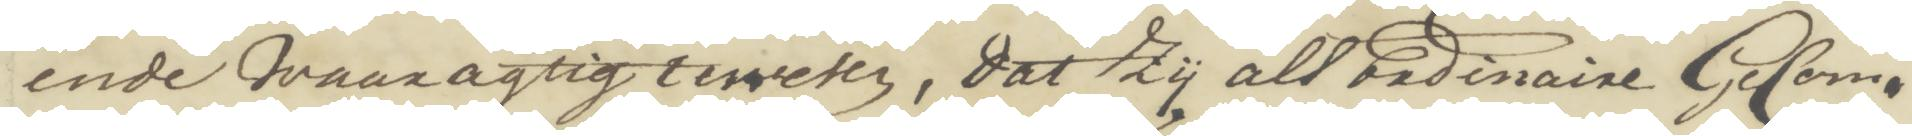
ende waaragtig teweten, dat zij als ordinaire Gecom„
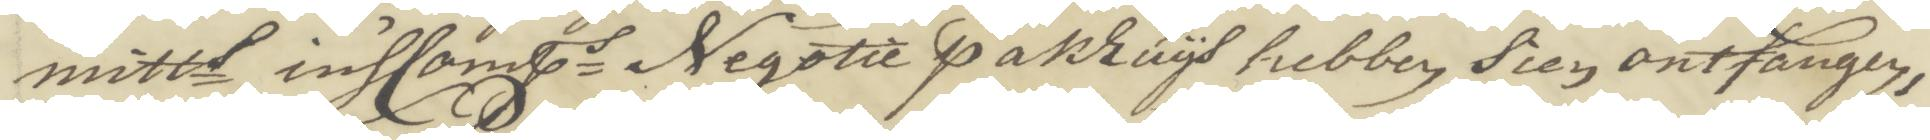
mitt=s in's Comp=s Negotie pakhuijs hebben sien ontfangen,
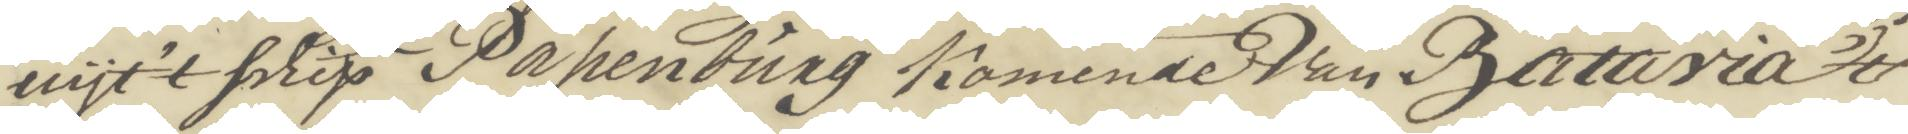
uijt ’t schip Papenburg komende van Batavia 't
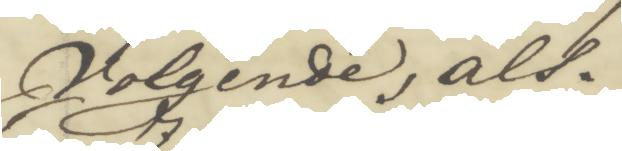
volgende, als.
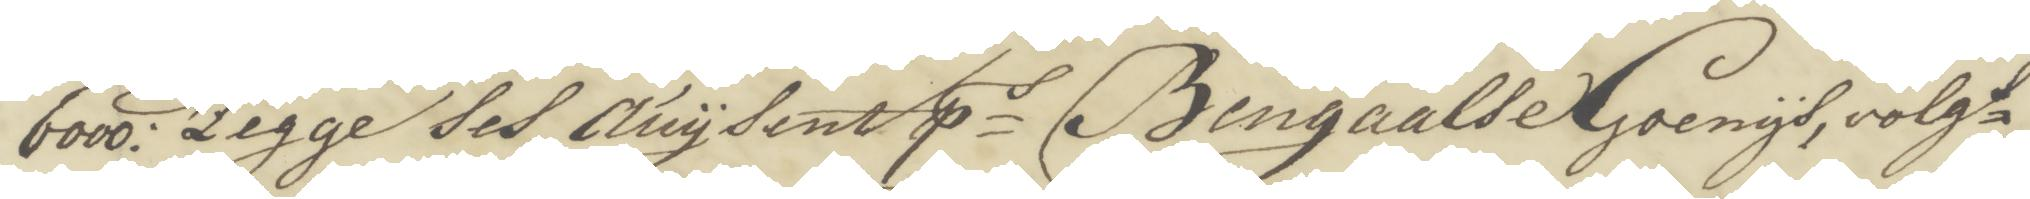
6000: zegge ses duijsent p=s Bengaalse Goenijs, volg=s
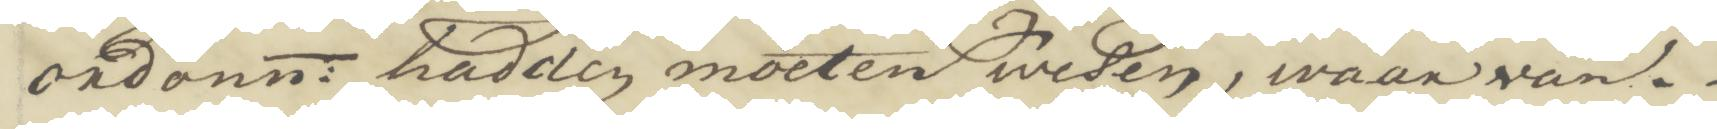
ordonn: hadden moeten wesen, waar van.
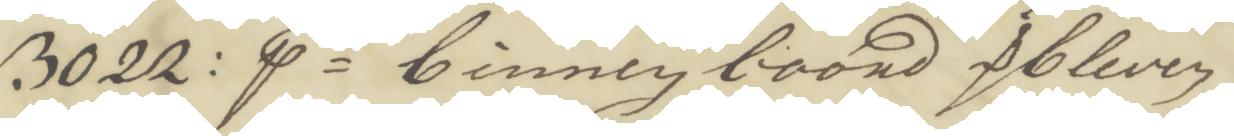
3022: p=s binnen boord verbleven
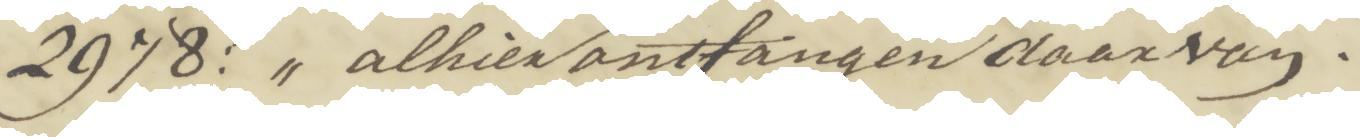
2978: „ alhier ontfangen daar van.
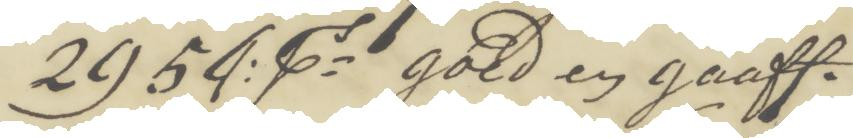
2954: p=s goed en gaaff.
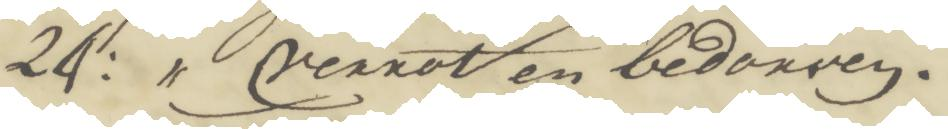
24: „ verrot en bedorven.
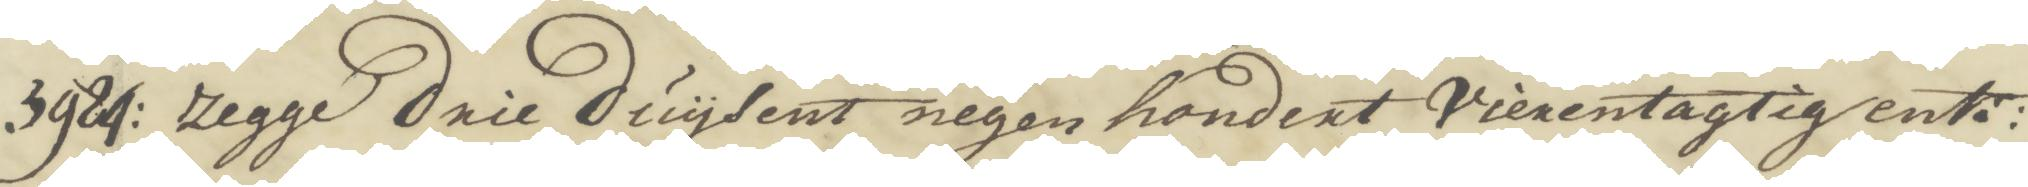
3984: zegge drie duijsent negen hondert vierentagtig ent:
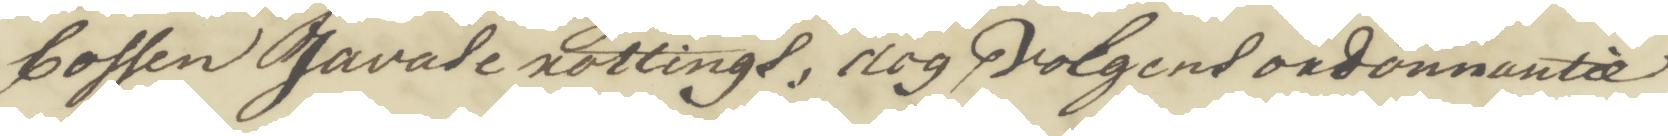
bossen Javase rottings, dog volgens ordonnantie
